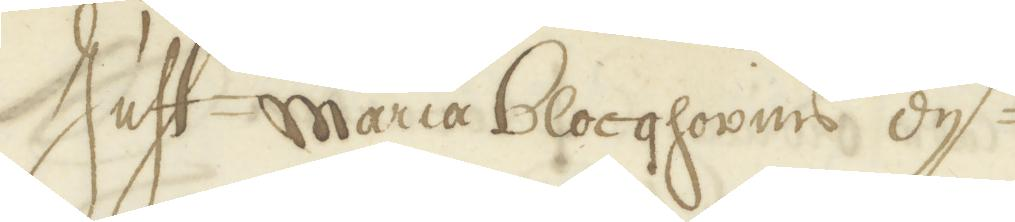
Juff=e maria blocqhovius eij=rce
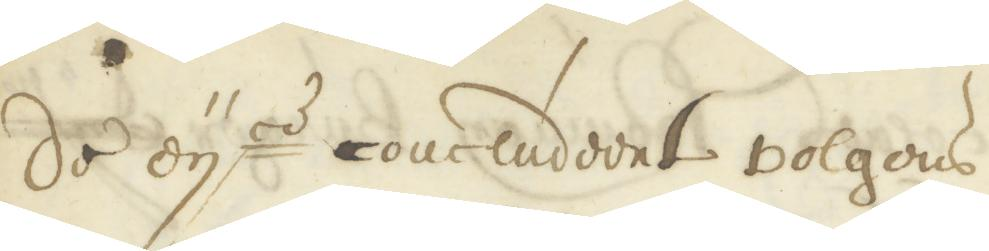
de eij=ce concludeert volgens
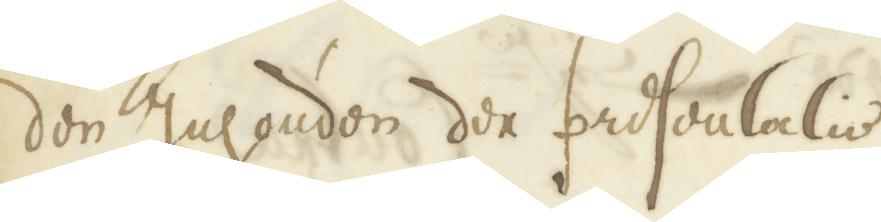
den Jnhouden der Presentatie
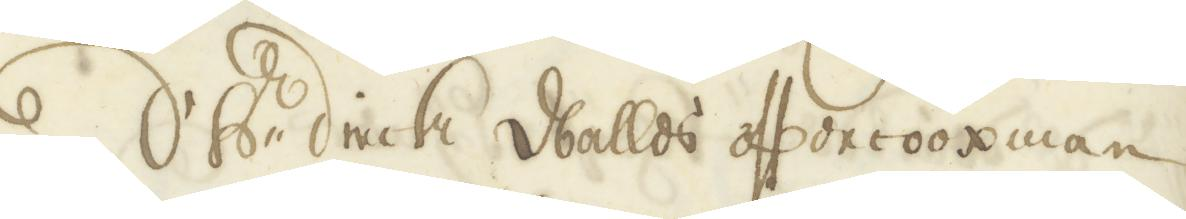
D’ H„r dirck Walles oppercoopman
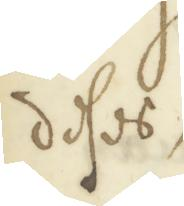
deses,
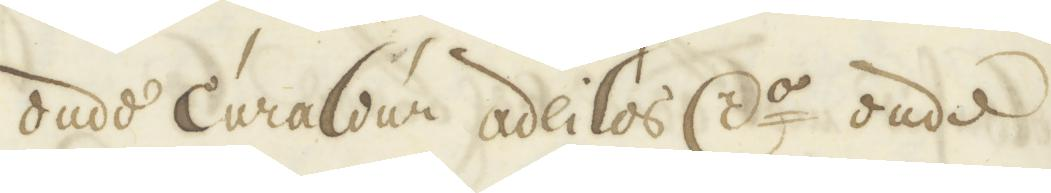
ende Curateur adlitos r=o ende
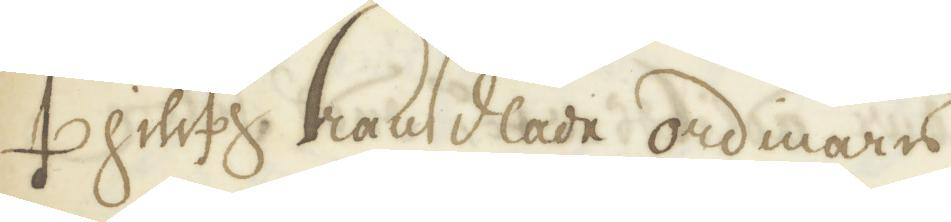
Philips kanselaer ordinaris
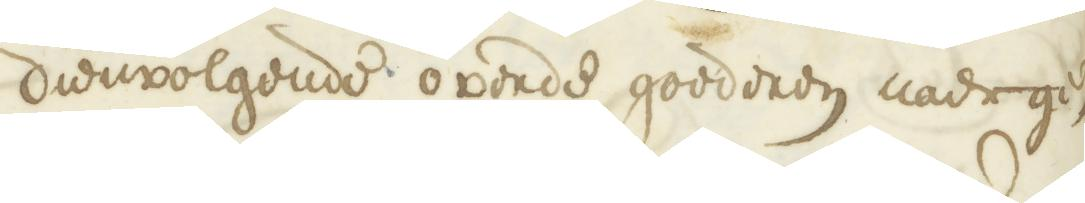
dienvolgende overde goederen naerge
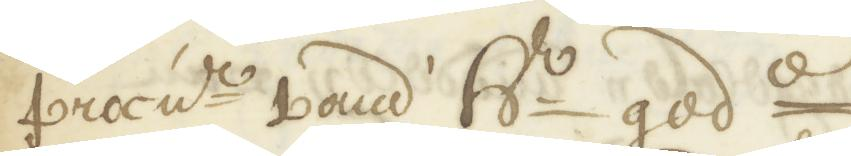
procu=r vand’ H=r ged=e
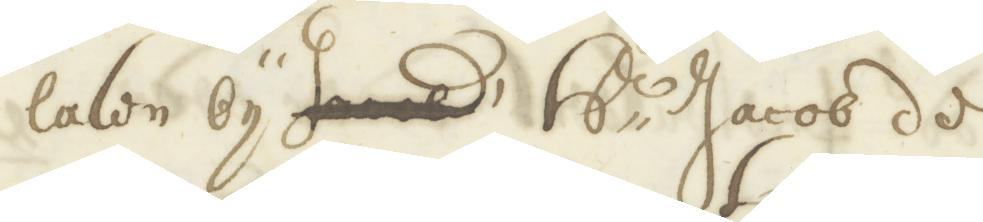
laten bij Jarel H„r Jacob de
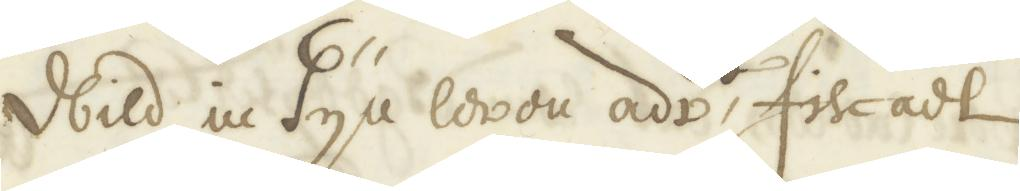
Wild in sijn leven adv,t fiscael
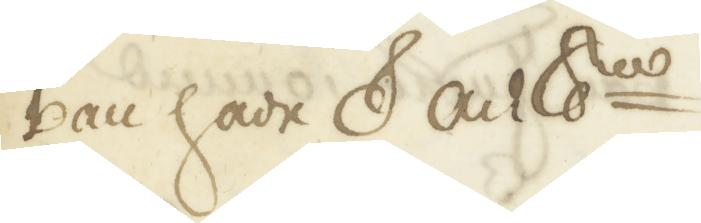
van haer E Achtb=re
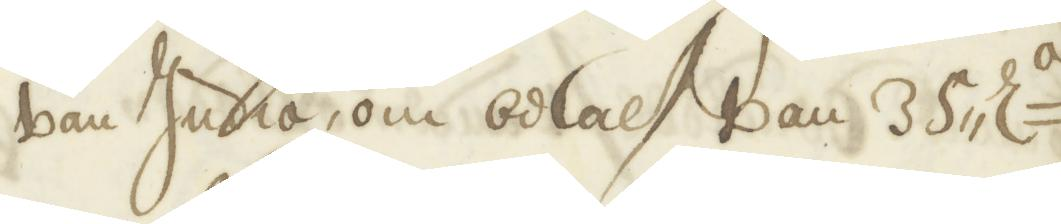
van Jndia, om betal/ van 35„ R=a
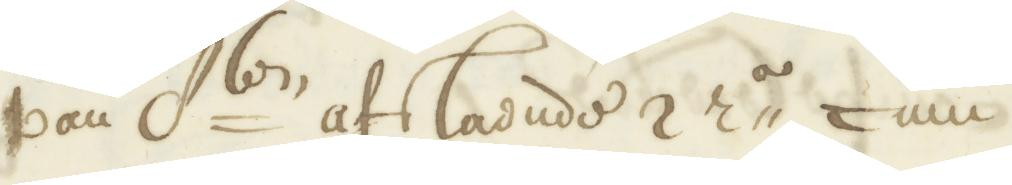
van 8=ten afstaende 2 r„a cum
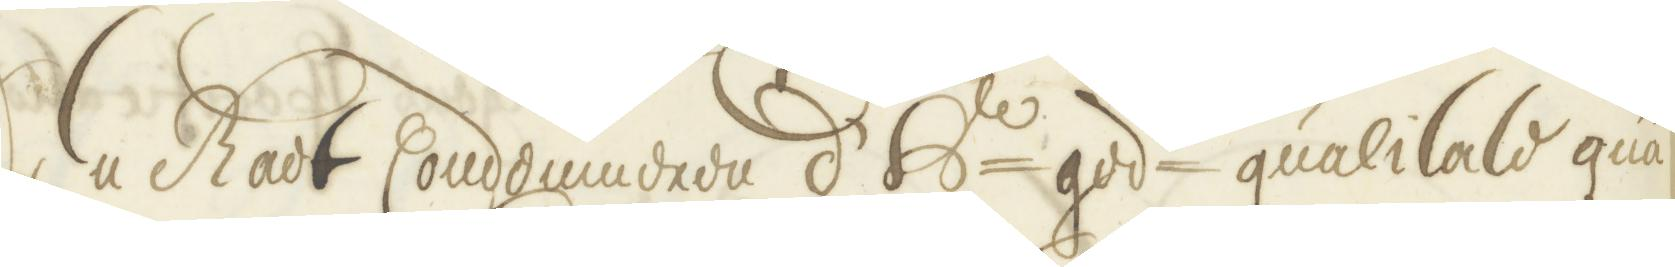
Den Raet Condemneren d’ H=e ged=e qualitate qua
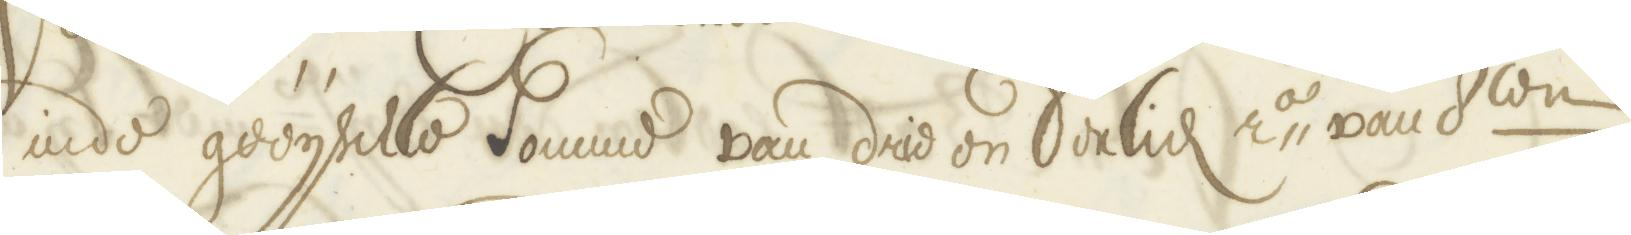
inde geeijschte somme van drie en Dertich r„a van 8-ten
